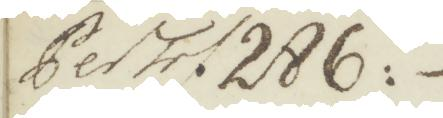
Per Trp 286: —
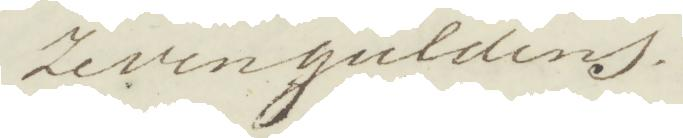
Zeven guldens.
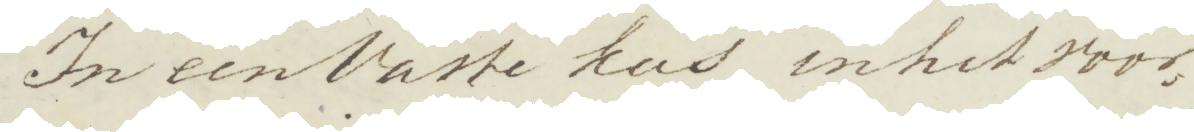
In een vaste kas in het voor„
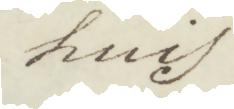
=huis
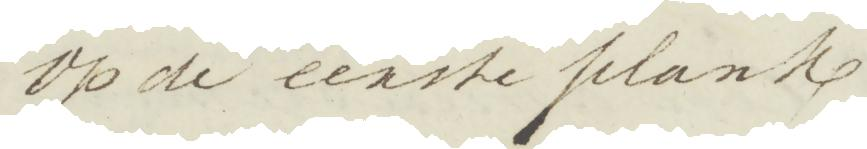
op de eerste plank
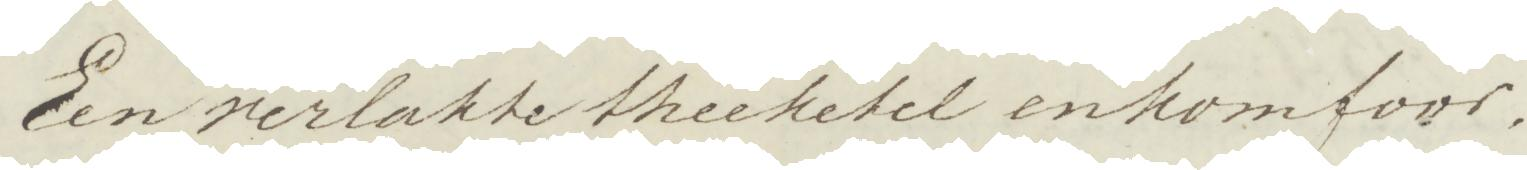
Een verlakte theeketel en komfoor.
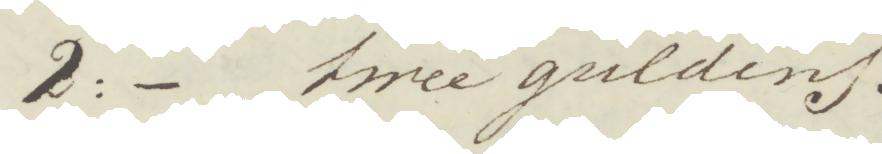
2: — twee guldens
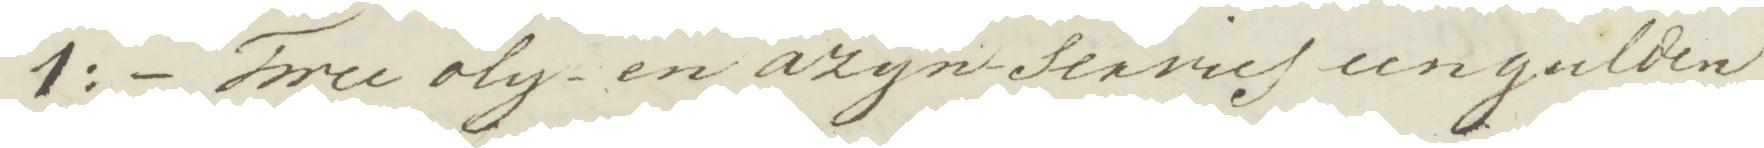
1: — Twee olij- en azijn servies een gulden
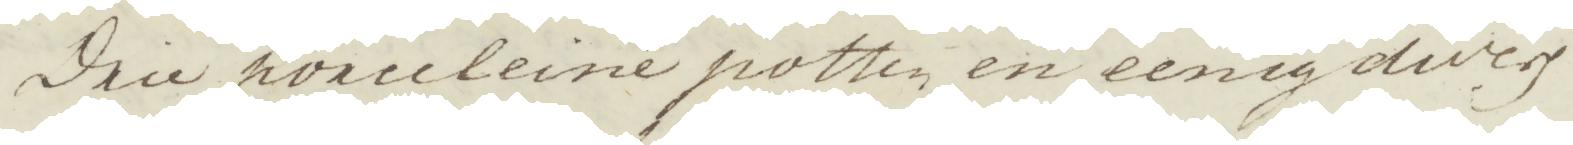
Drie porceleine potten en eenig divers
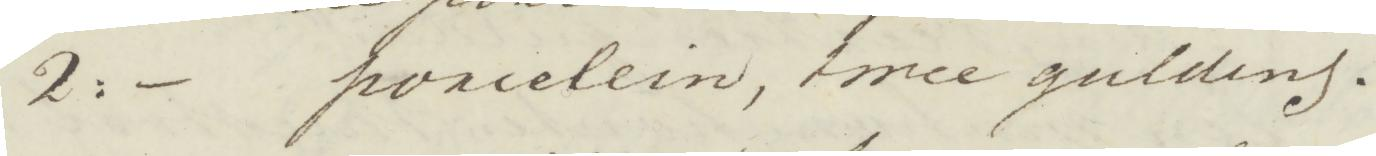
2: — porcelein, twee guldens.
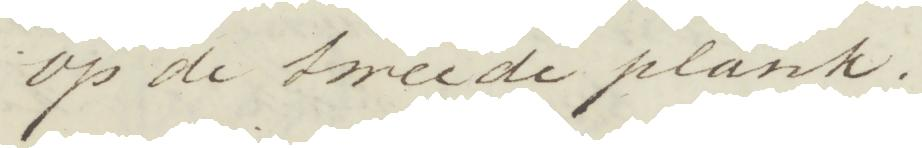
op de tweede plank.
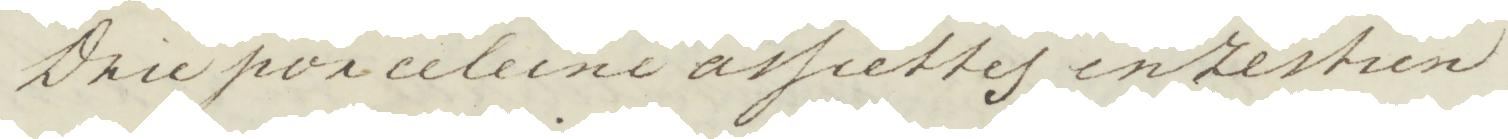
Drie porceleine assiettes en zestien
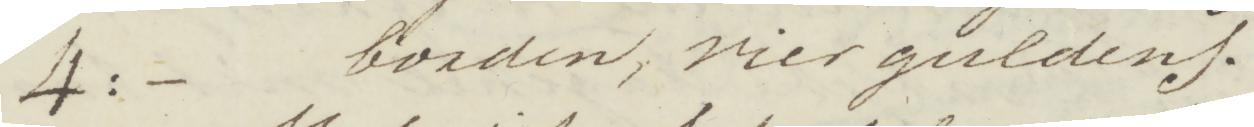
4: — borden, vier guldens.
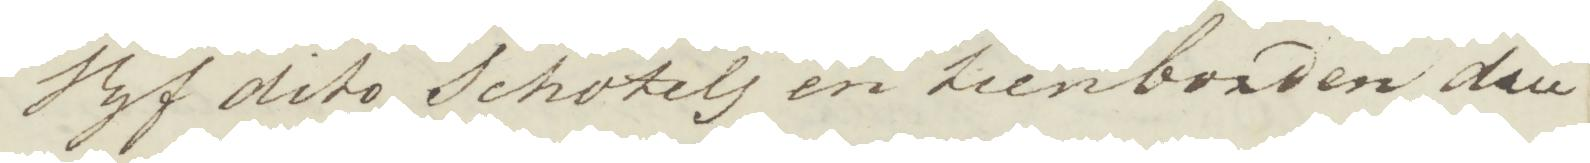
Vijf dito schotels en tien borden, drie
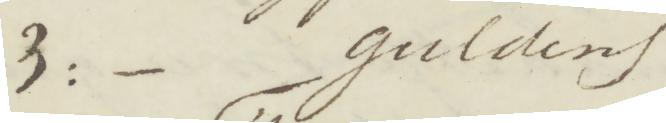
3:— guldens
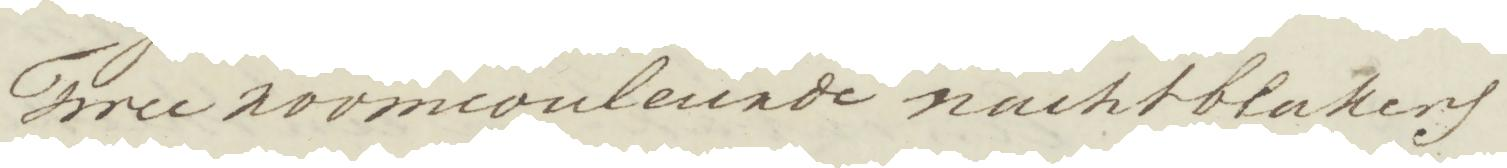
Twee roomcouleurde nachtblakers
